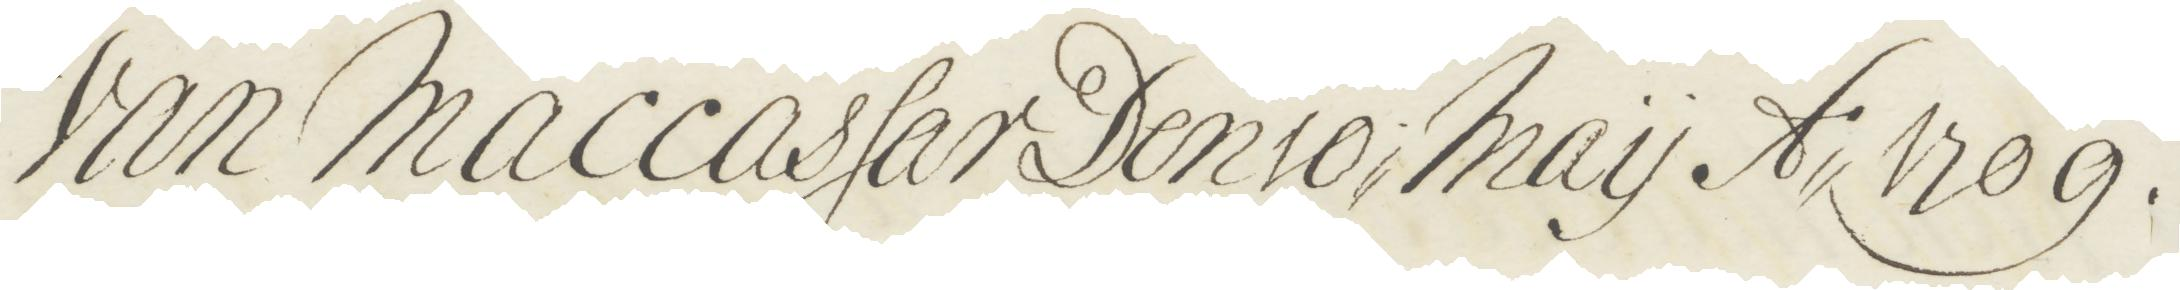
Van Maccassar Den 10„' Maij A„o 1709.
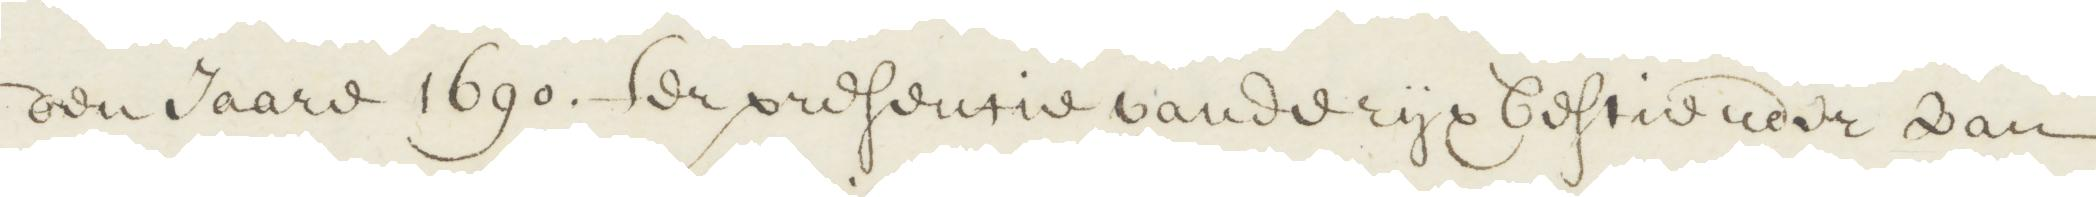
den Iaare 1690. ter presentie van de rijx bestierder van
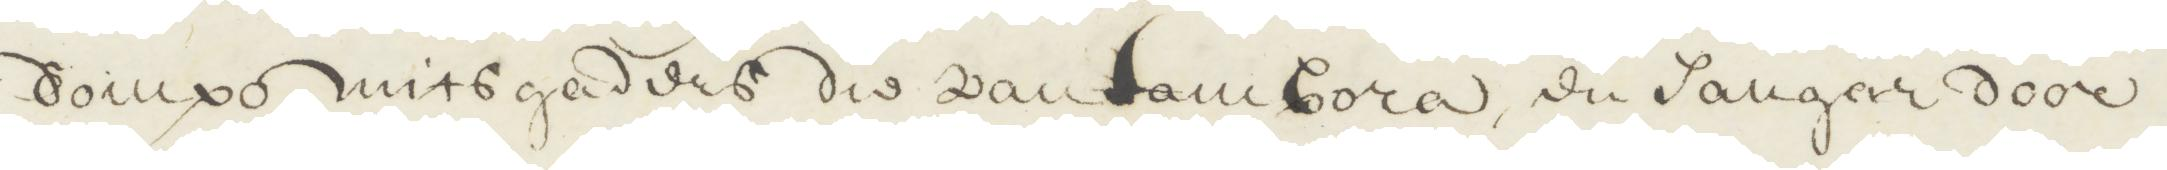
dompo, mitsgaders die van tambora, en sangar door
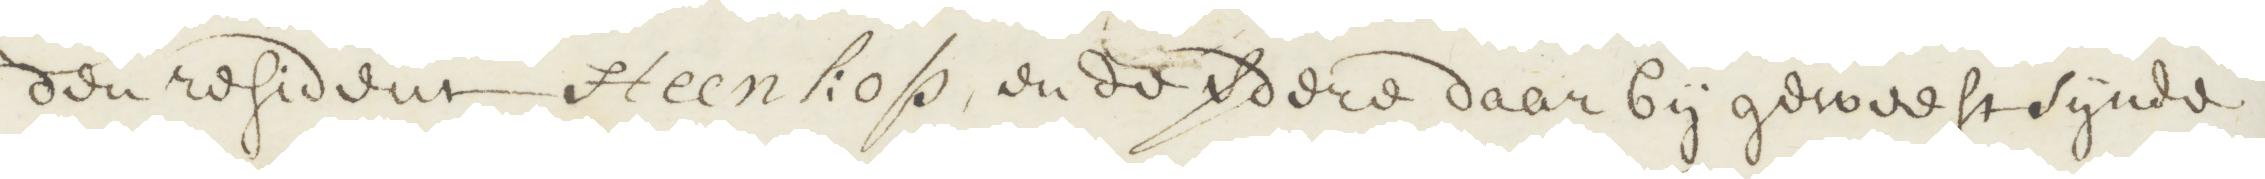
den resident steenkop, en de verdere daar bij geweest sijnde
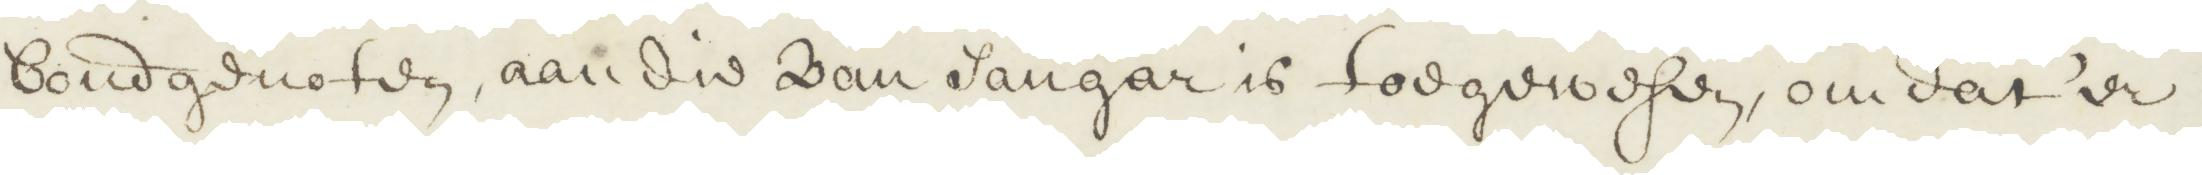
bondgenoten, aan die van sangar is toegewesen, om dat 'er
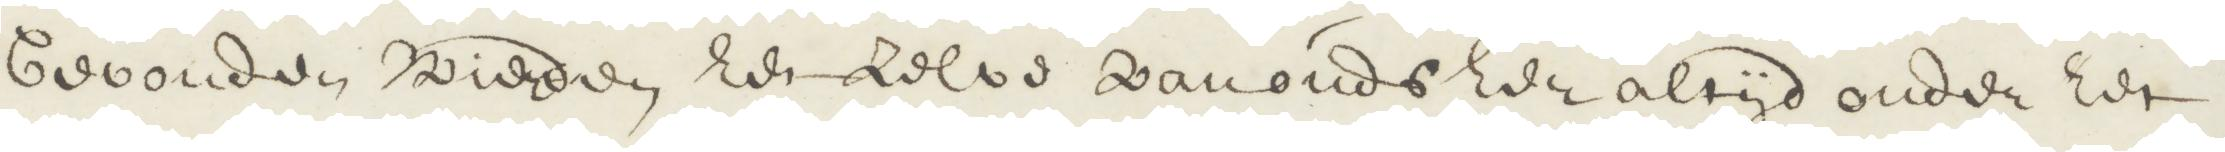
bevonden wierden het zelve van oudsher altijd onder het
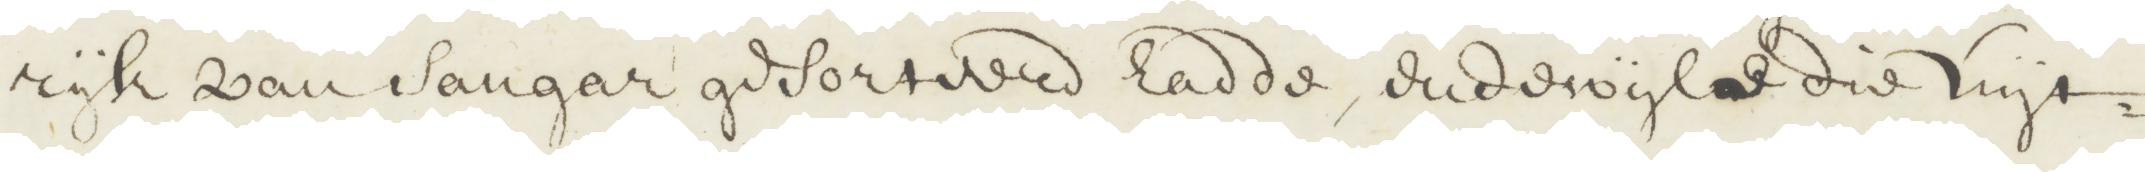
rijk van Sangar gesorteerd hadde, endewijle die uijt=
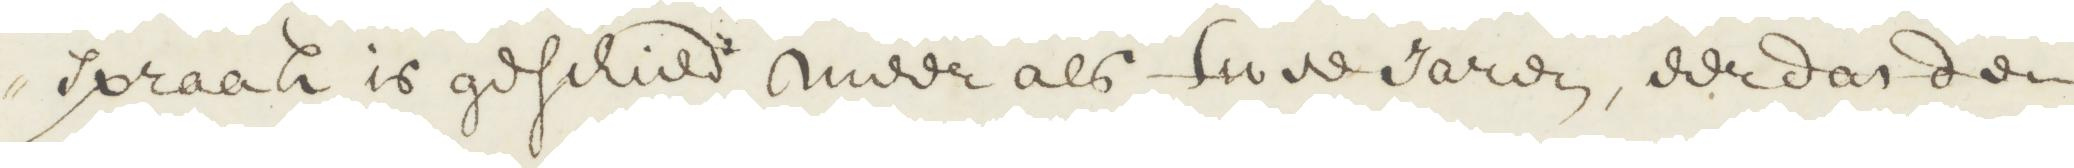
„ spraak is geschied meer als twee Iaren, eerdat den
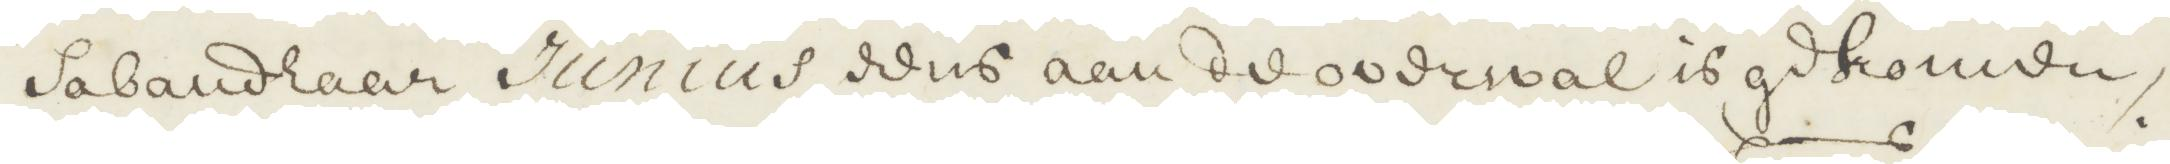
sabandhaar Iunius eens aan de overwal is gekomen,
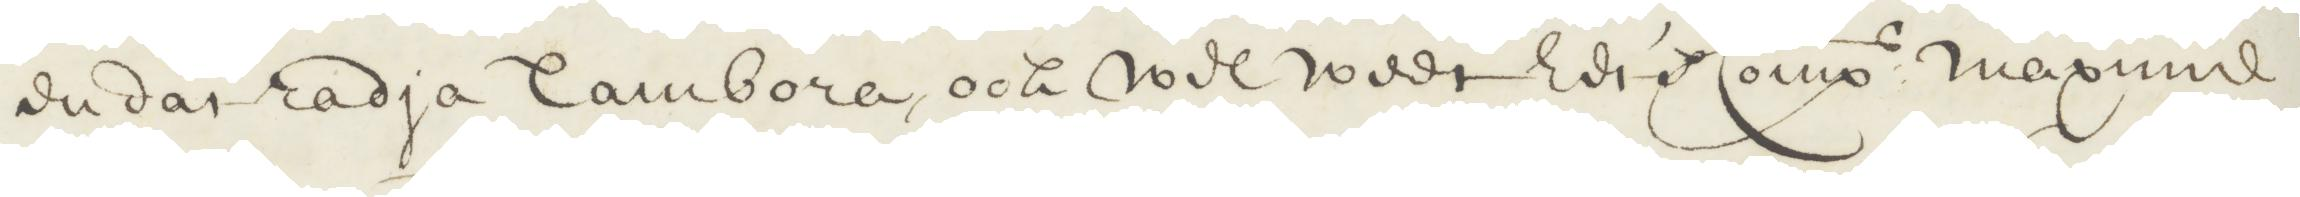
en dat radja Tambora, ook wel weet het ’s Comp:s maxime
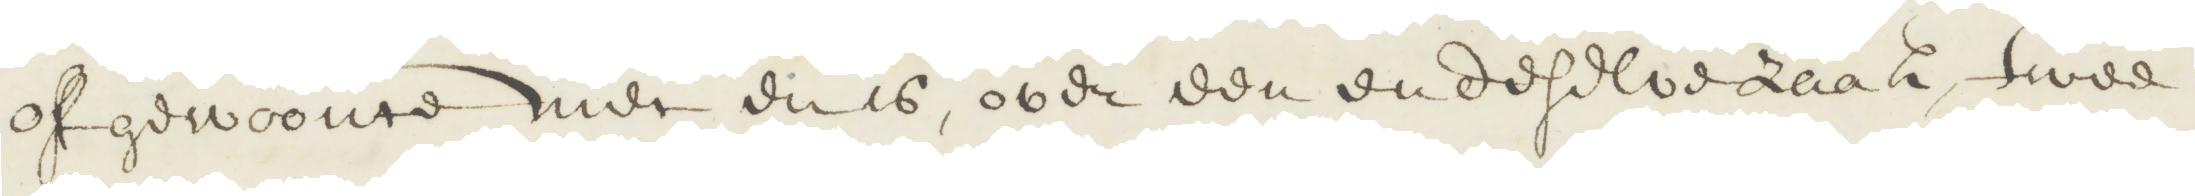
of gewoonte niet en is, over een en deselve zaak, twee
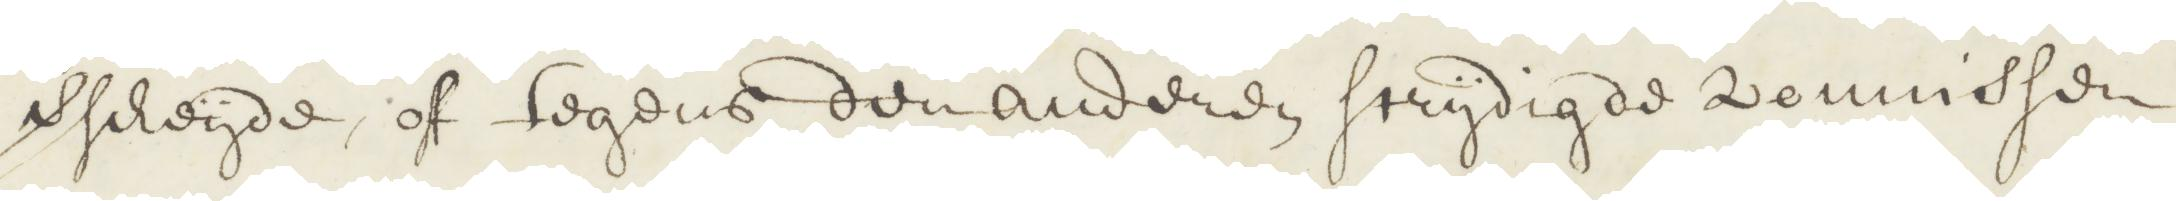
verscheijde, of tegens den anderen strijdigde vonnissen
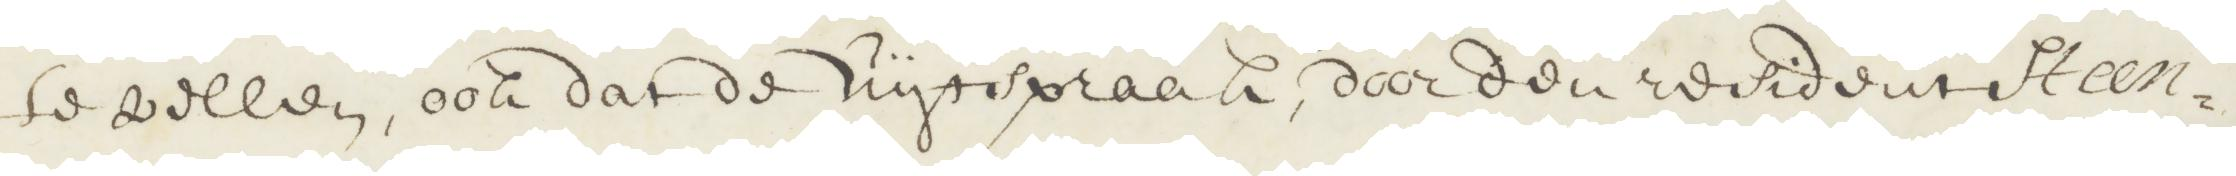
te vellen, ook dat de uijtspraak, door den resident steen=
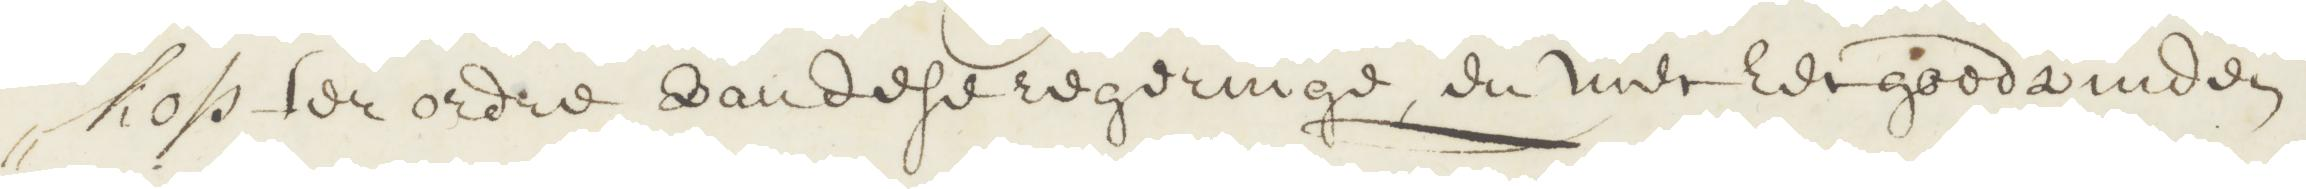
„ kop ter ordre van dese regeringe, en met het goedvinden
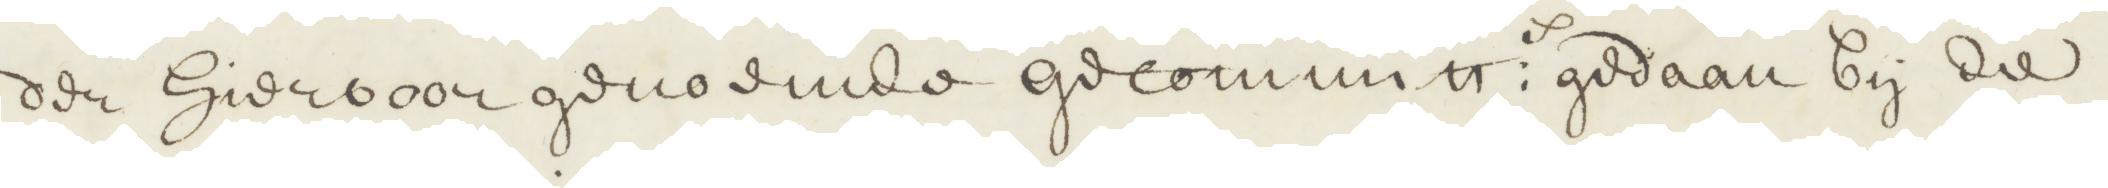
der hiervoor genoemde gecommitt:s gedaan bij die
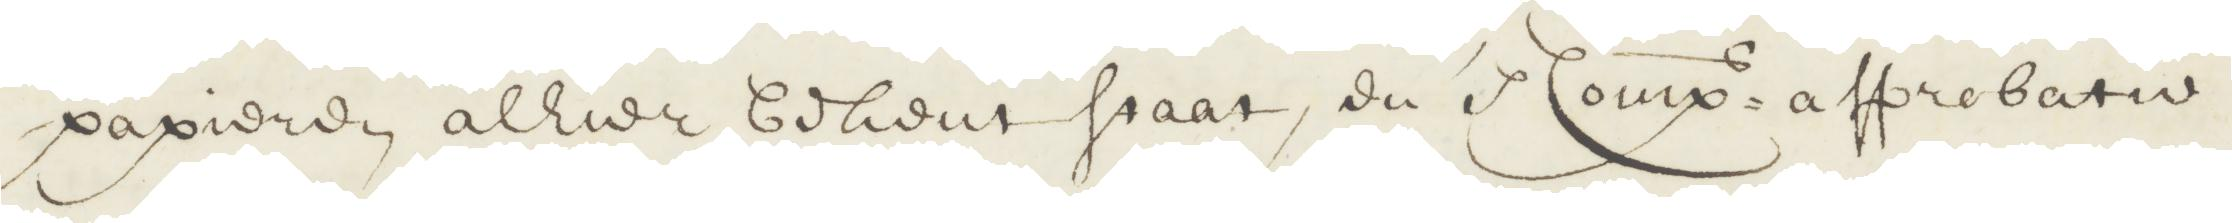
papieren alhier bekent staat, en ’s Comp=s approbatie
